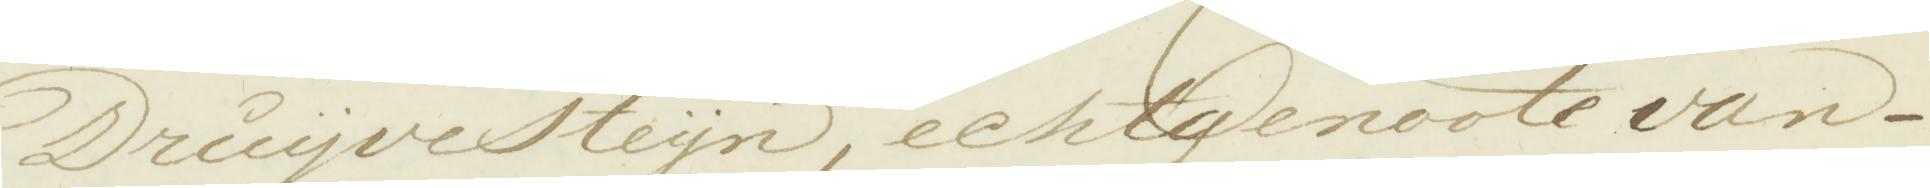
Druijvesteijn, echtgenoote van-
